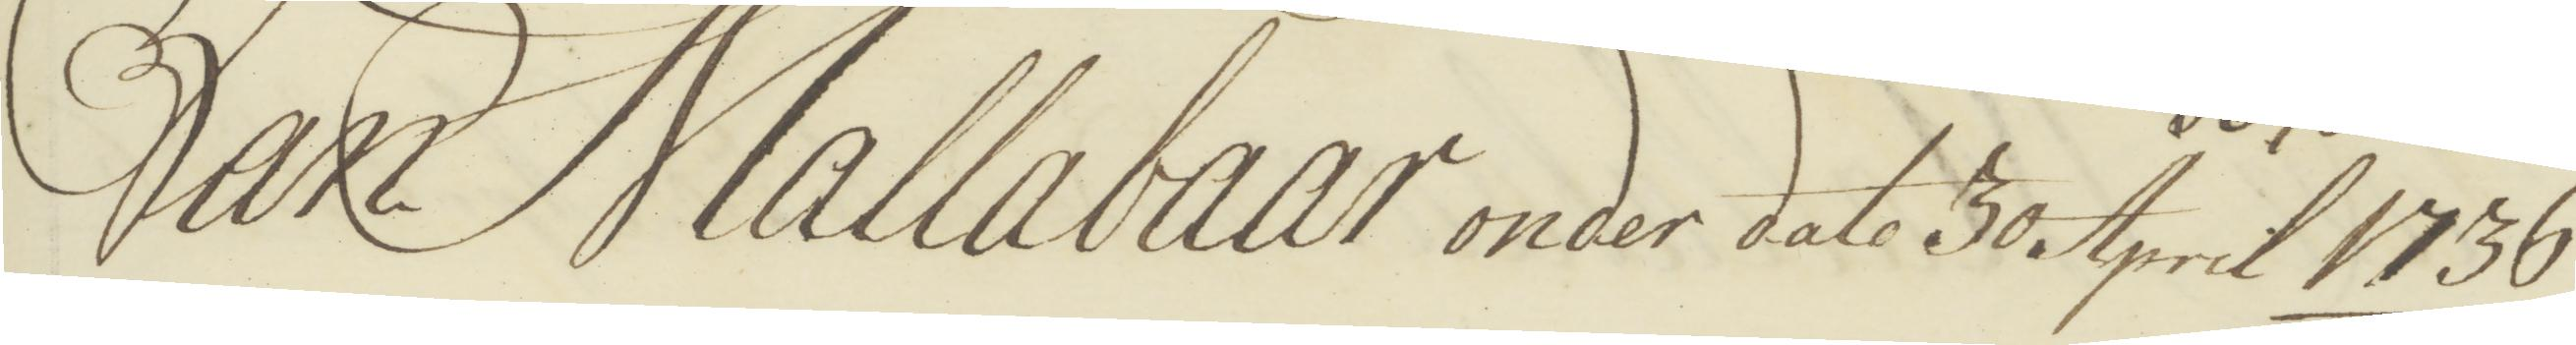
Van Mallabaar onder dato 30. April 1736
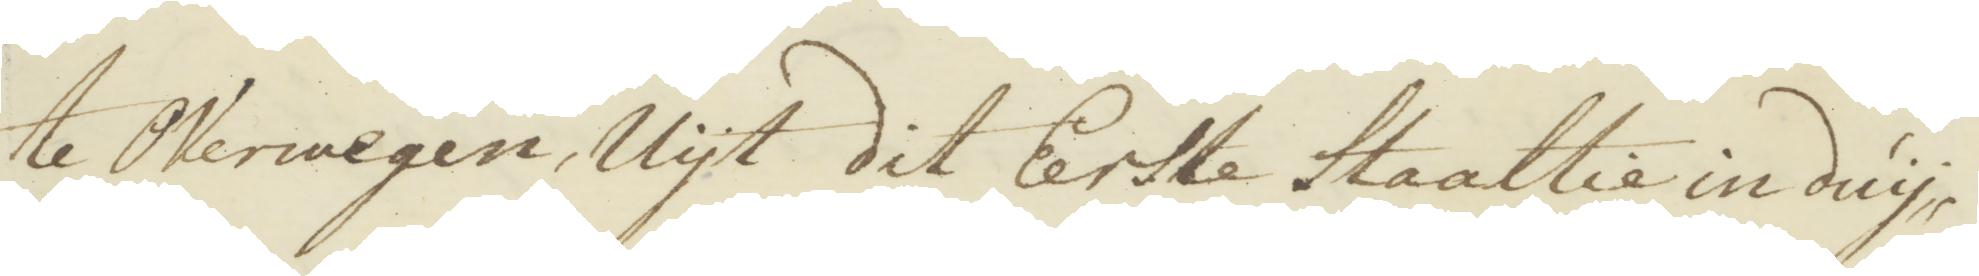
te Overwegen, Uijt dit Eerste staaltie in duij„
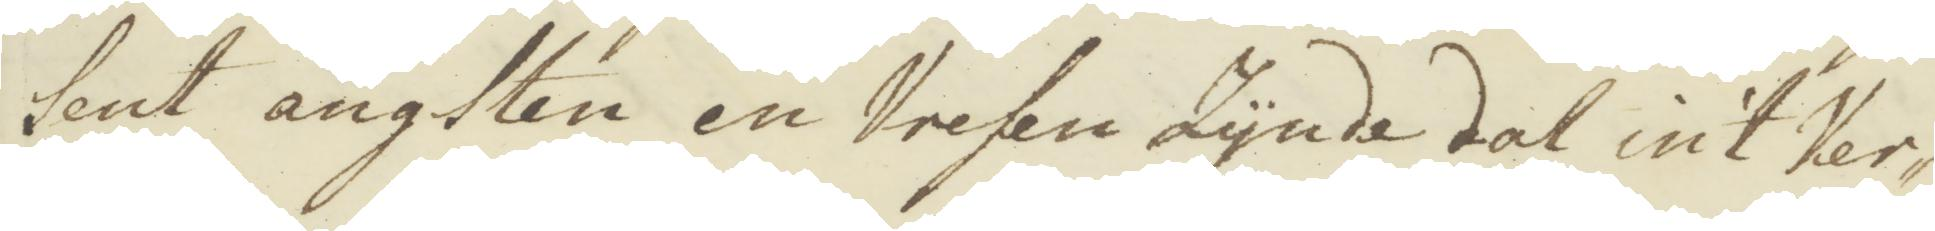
sent angsten en vresen zijnde dat in ’t ver„
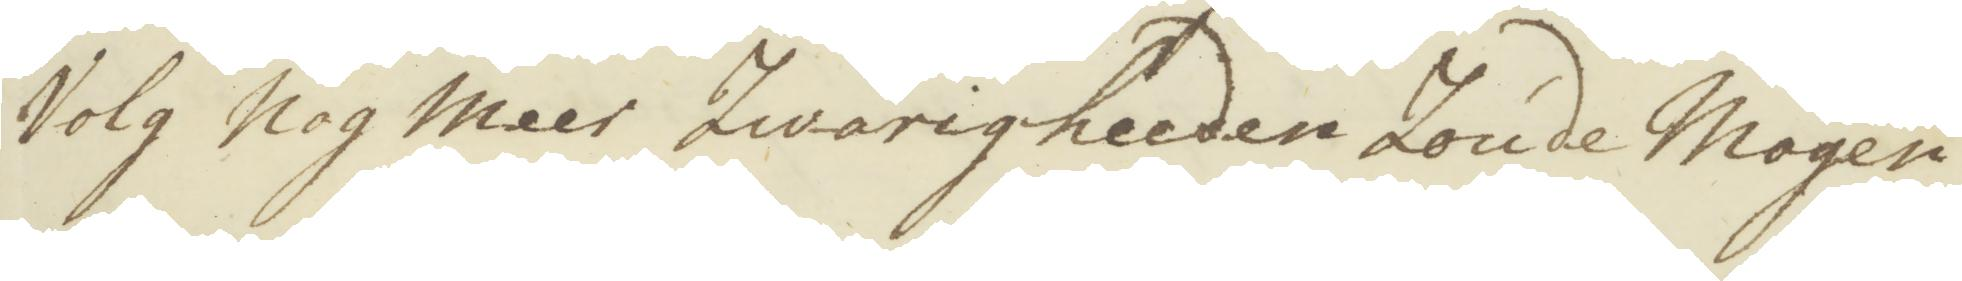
volg nog meer zwarigheeden zoude mogen
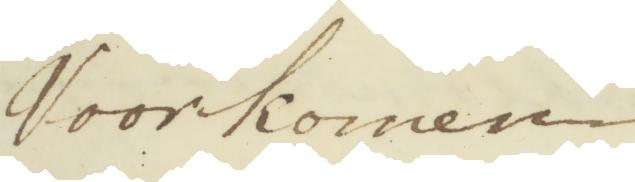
voor komen
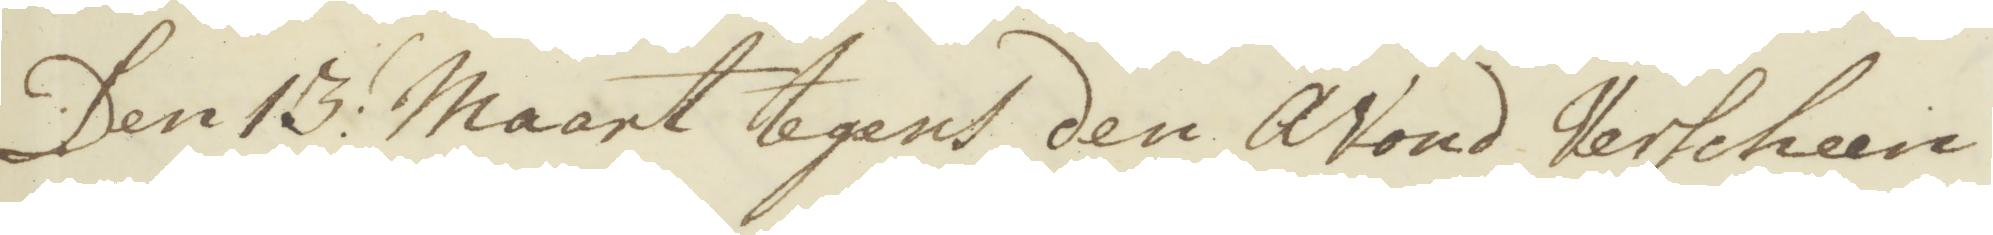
Den 13:' Maart tegens den Avond verscheen
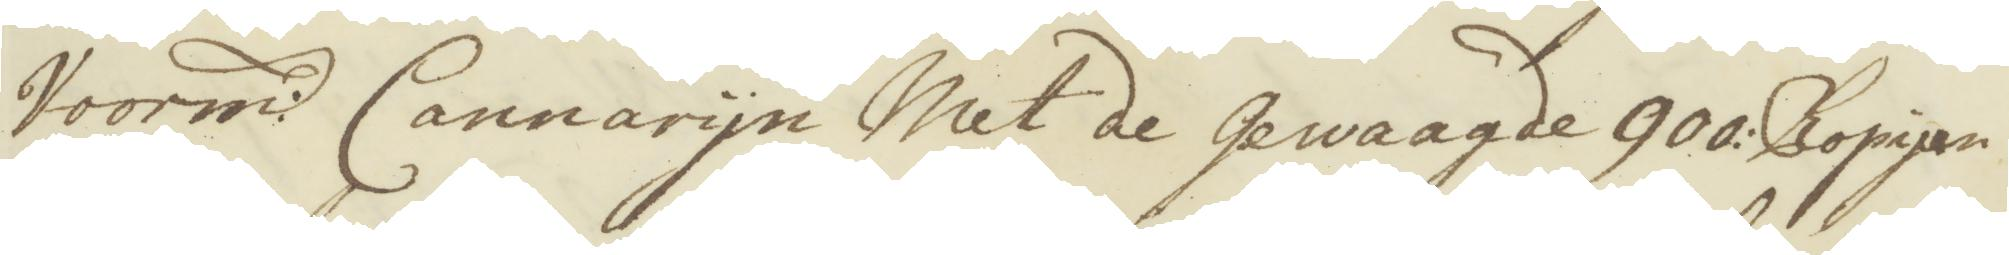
voorm: Cannarijn met de gewaagde 900: Kopijen
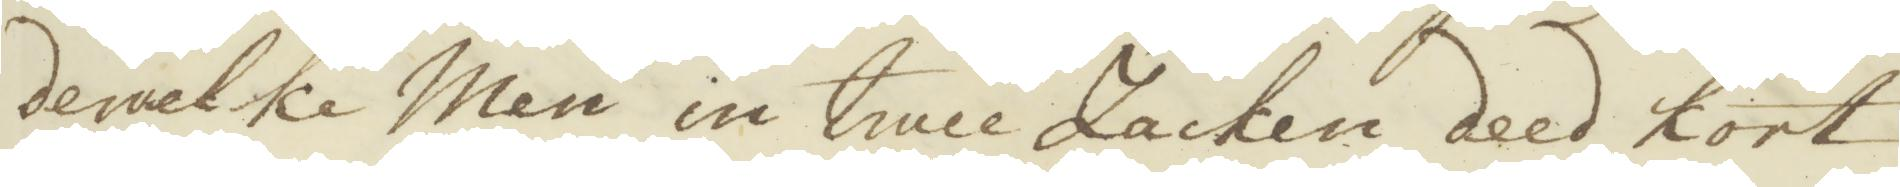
dewelke men in twee zacken deed kort
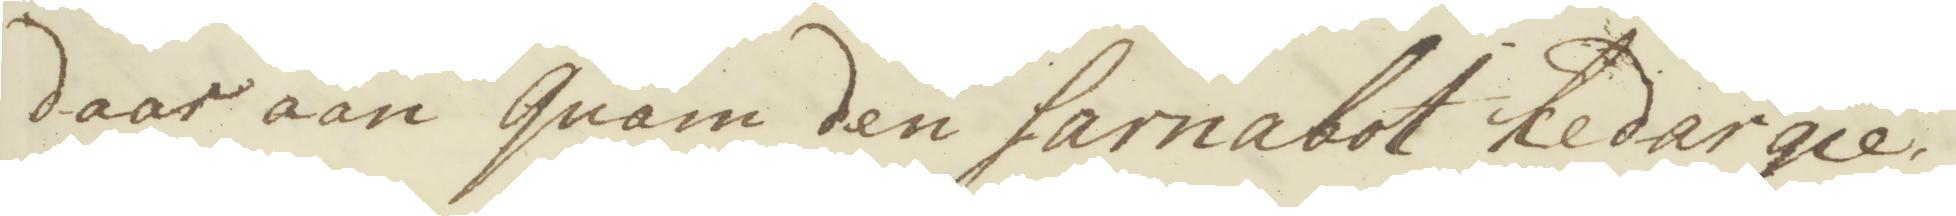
daar aan quam den farnabot kedargie,
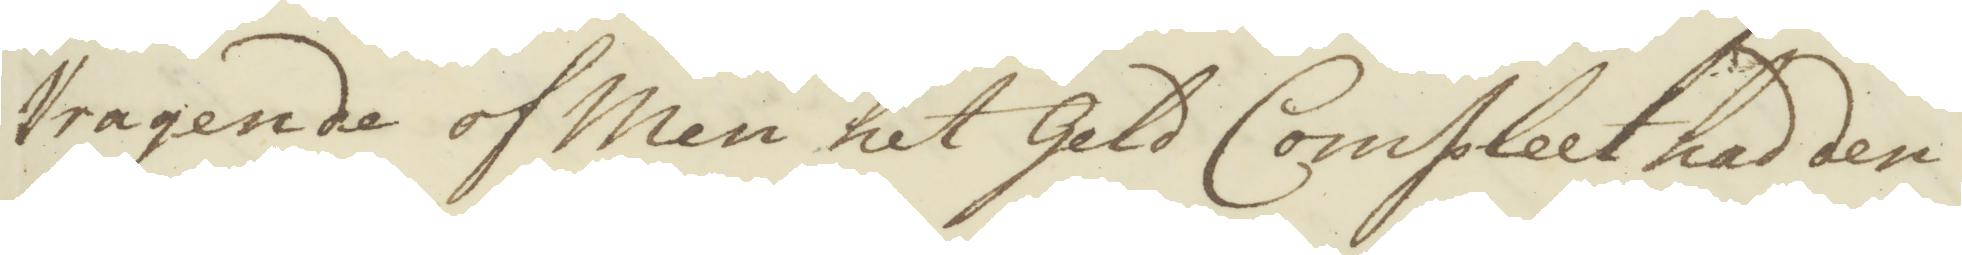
vragende of men het geld Compleet had den
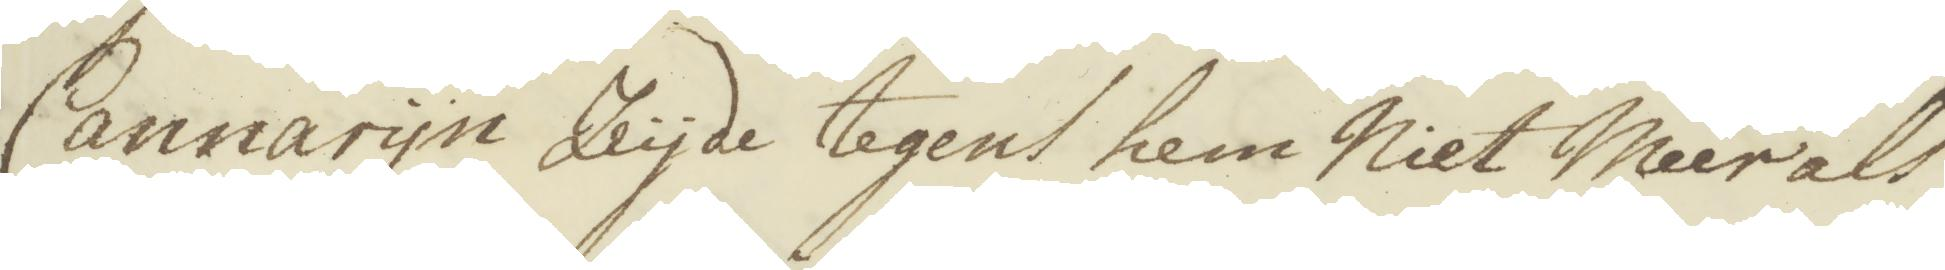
Cannarijn zeijde tegens hem niet meer als
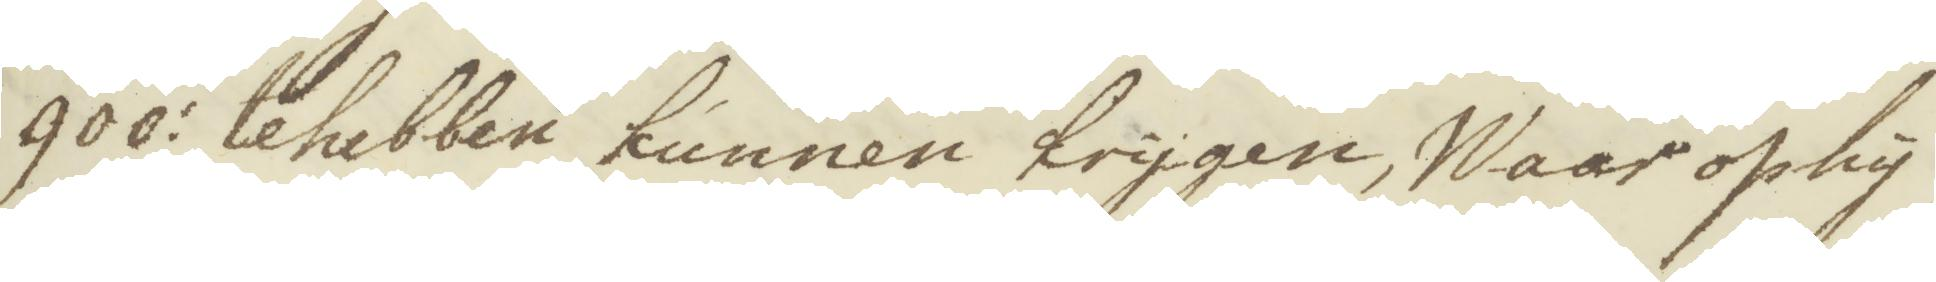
900: tehebben kunnen krijgen, waar op hij
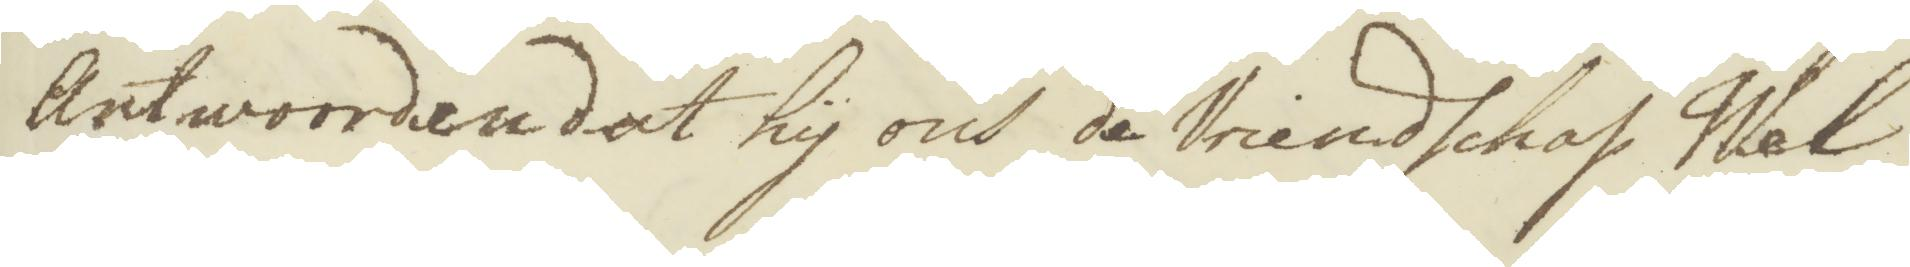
Antwoorden dat hij ons de vriendschap wel
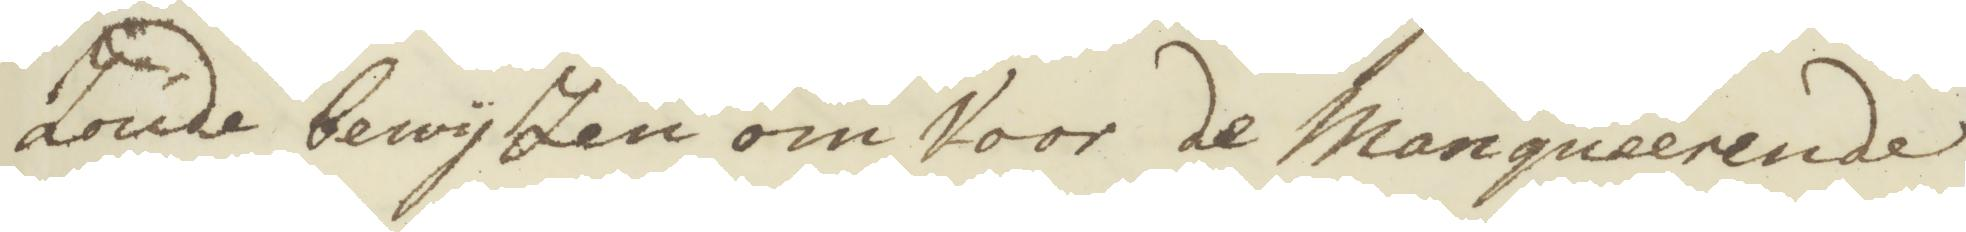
zoude bewijzen om voor de manqueerende
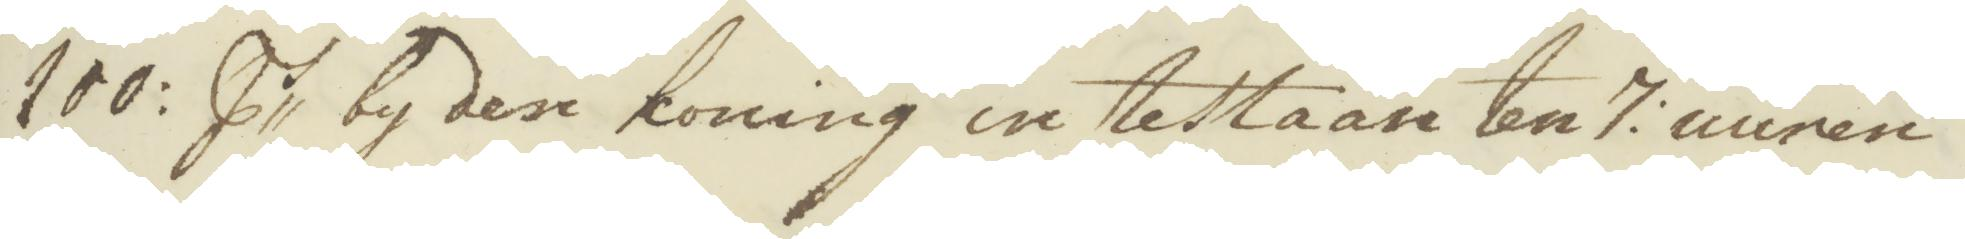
100: p„s bij den koning in testaan ten 7: uuren
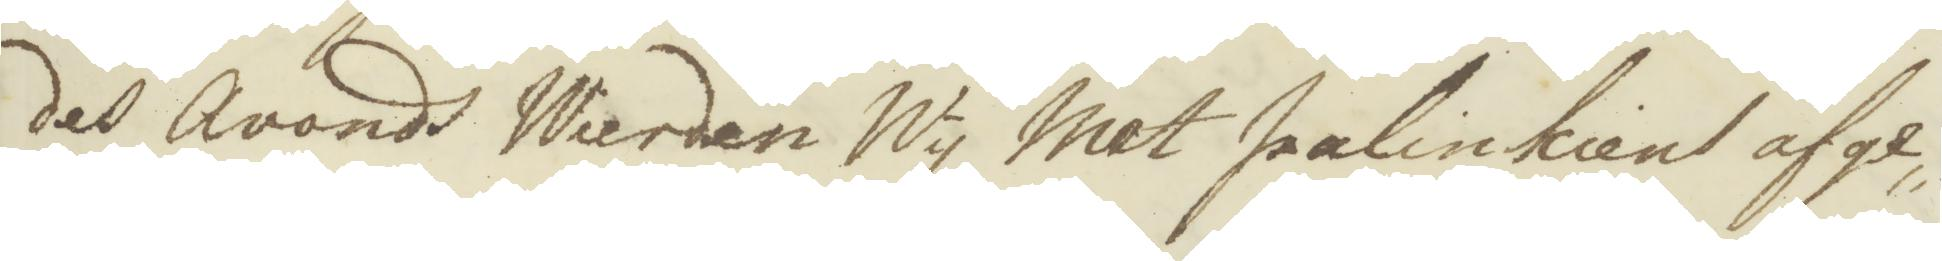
des Avonds wierden wij met palinkiens afge„
